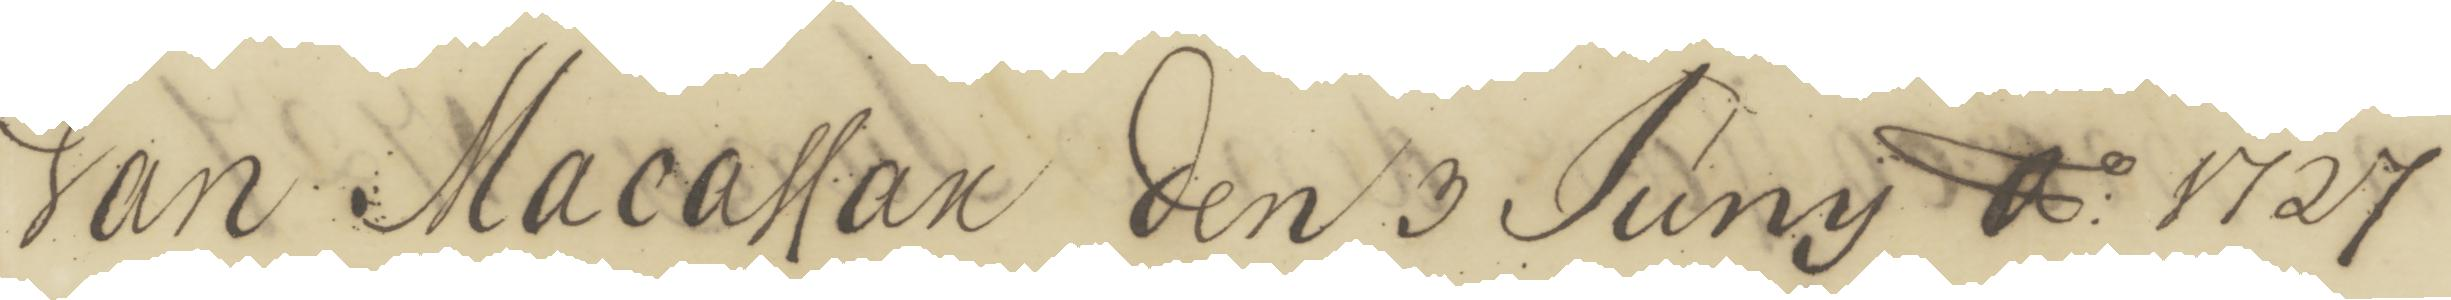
Van Macassar den 3 Iunij A:o 1727
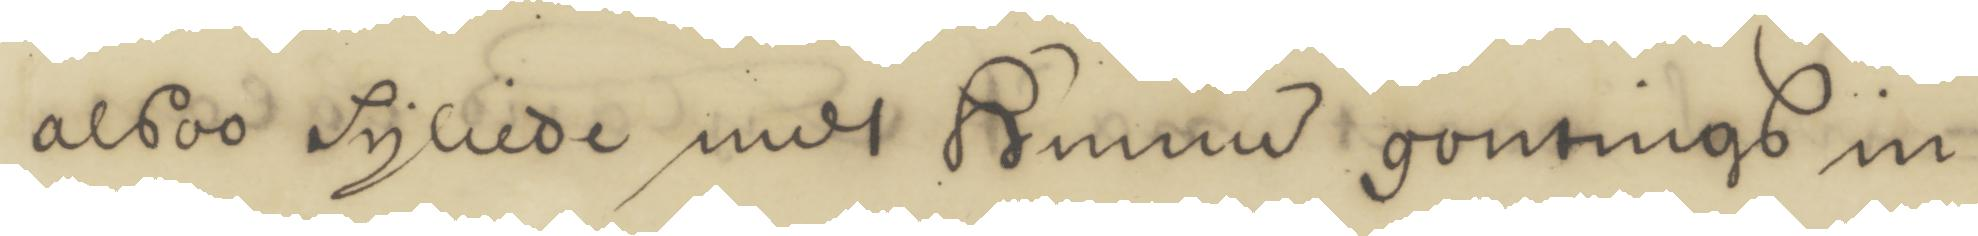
alsoo sijliede met hunne gontings in
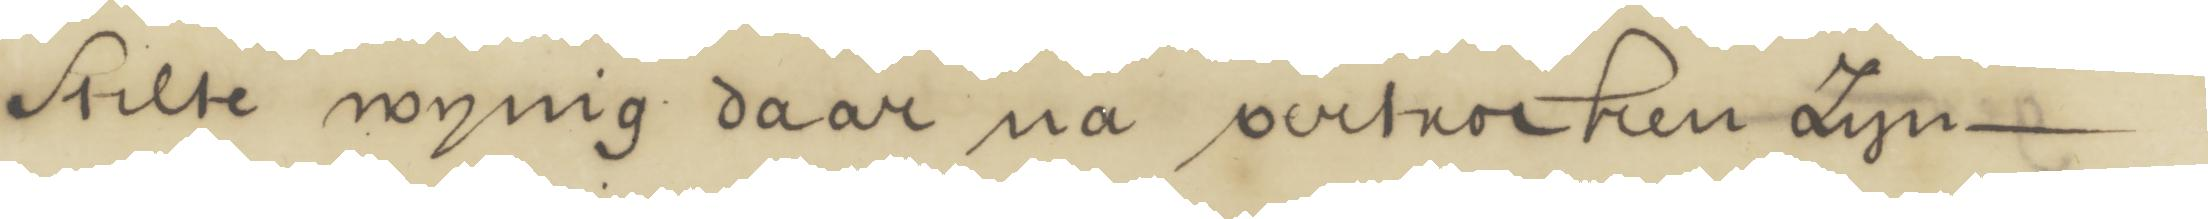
stilte wynig daar na vertrocken zyn
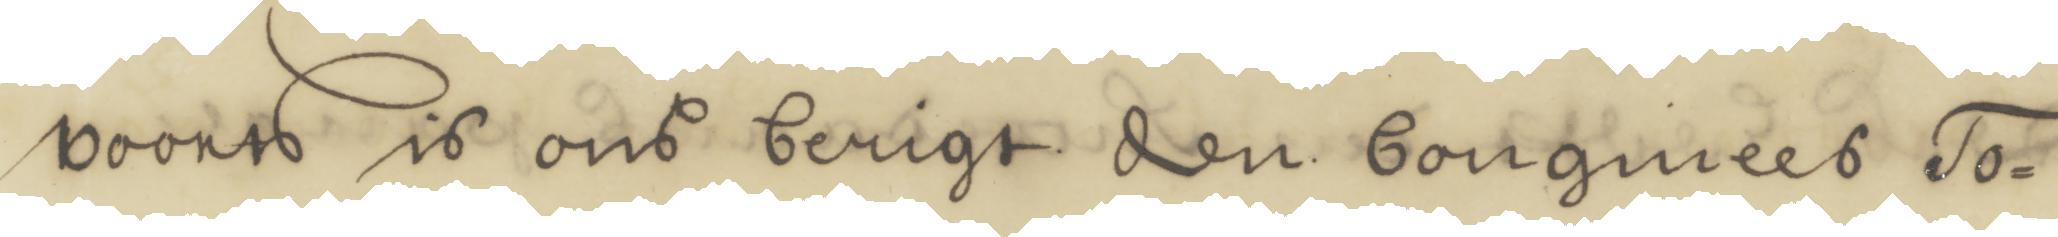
voorts is ons berigt den bouginees To=
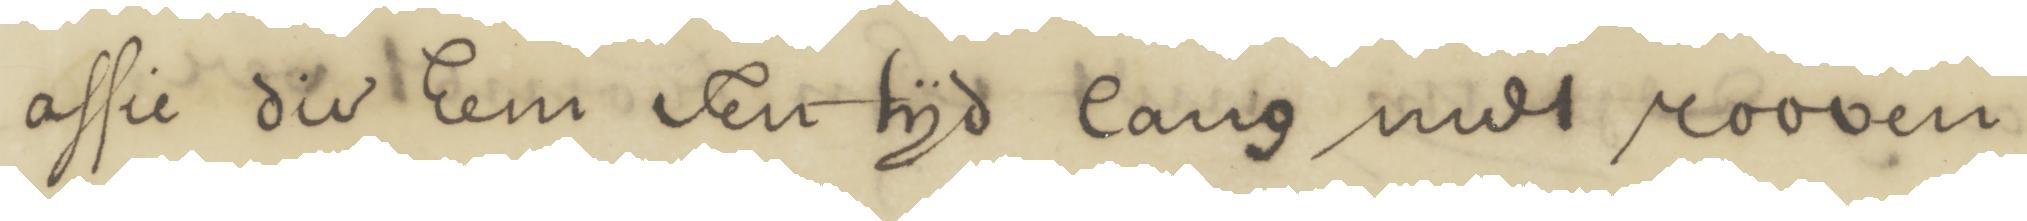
assie die hem Een tijd lang met rooven
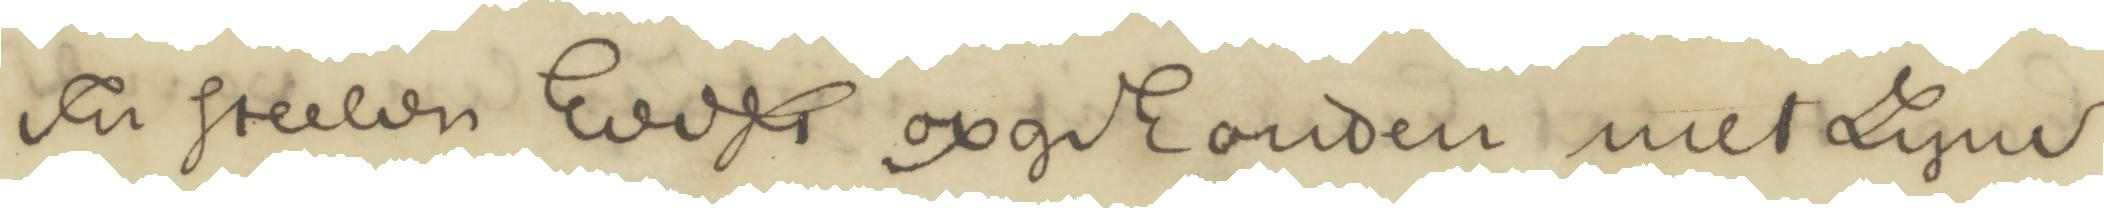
En steelen heeft opgehouden met zijne
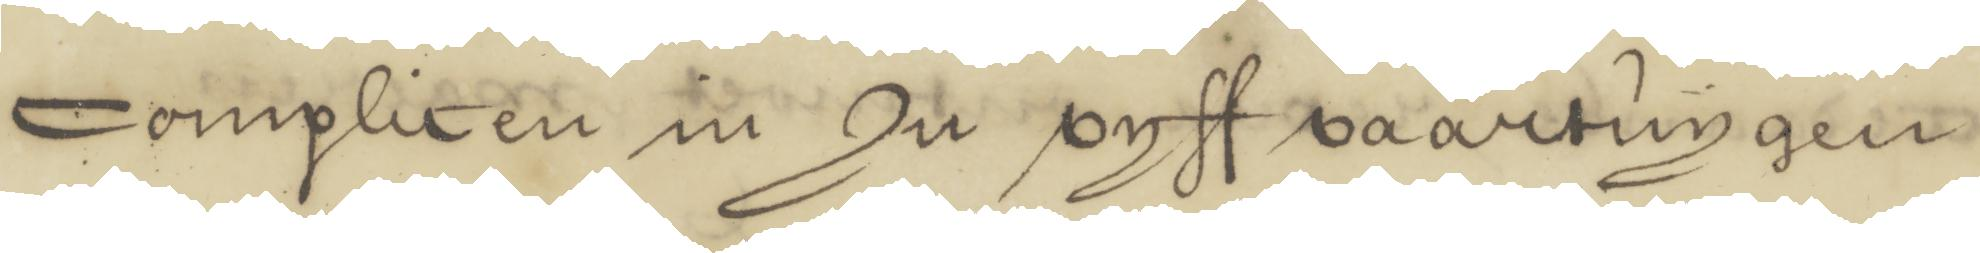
complicen in jn vyff vaartuijgen
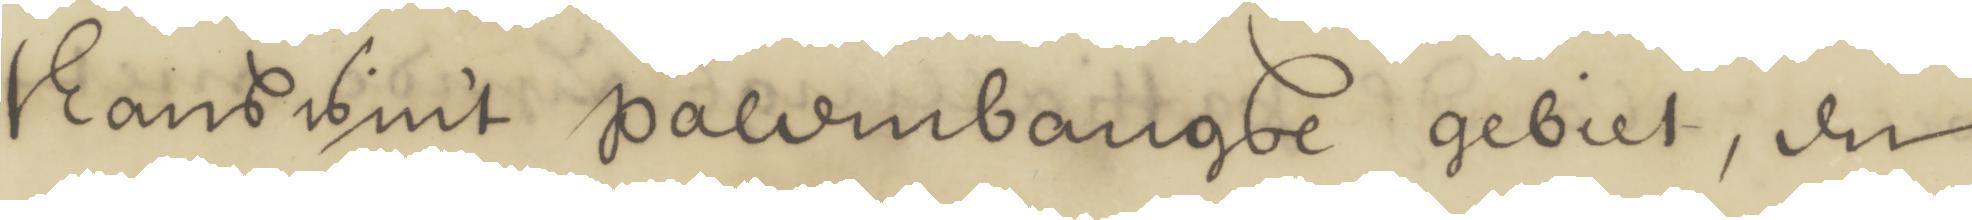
thans is in't palembangse gebiet, en
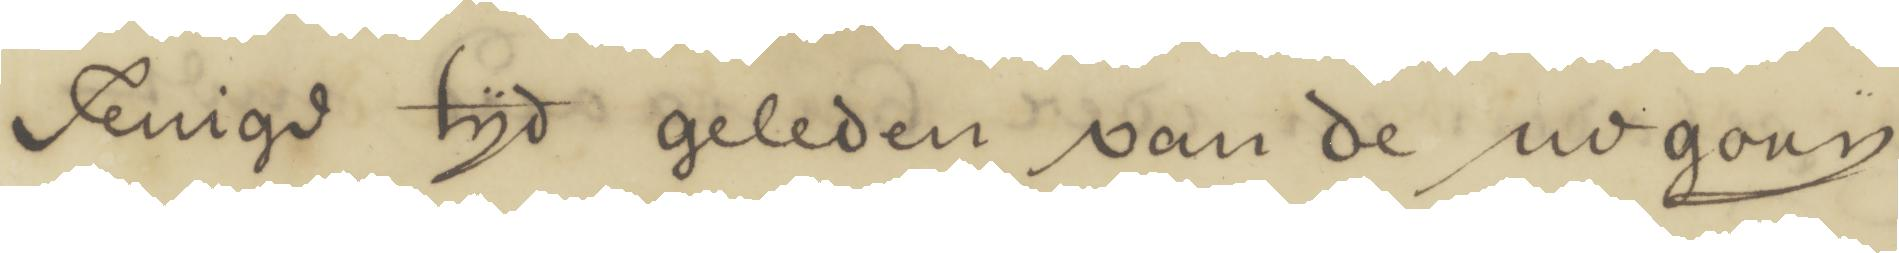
Eenige tijd geleden van de negorij
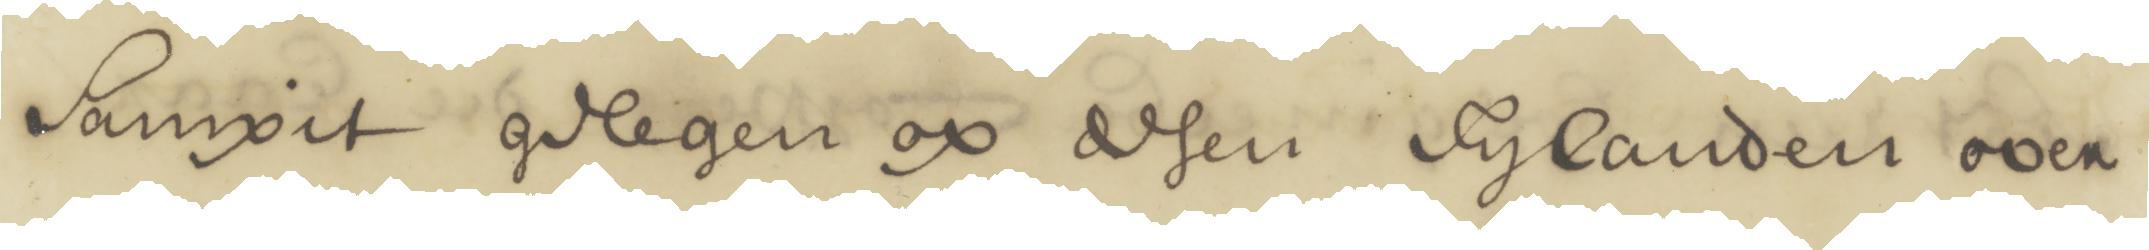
Sampit gelegen op desen Eylanden over
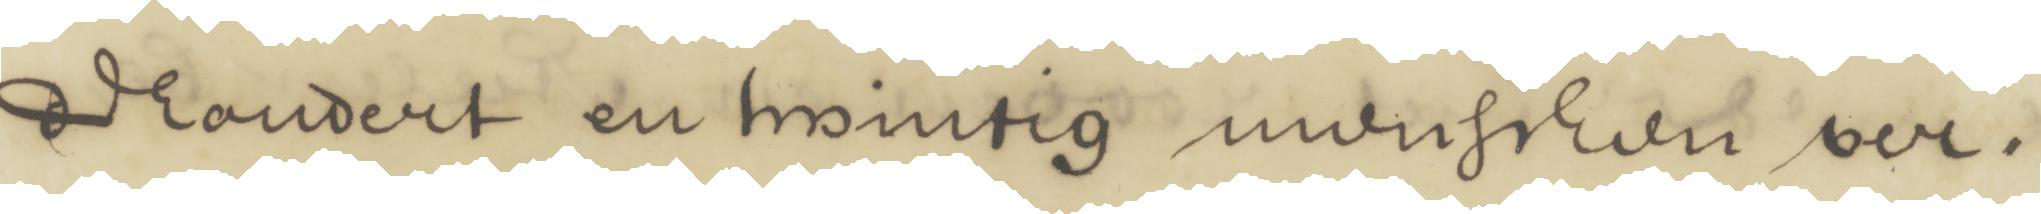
dehondert en twintig menschen ver„
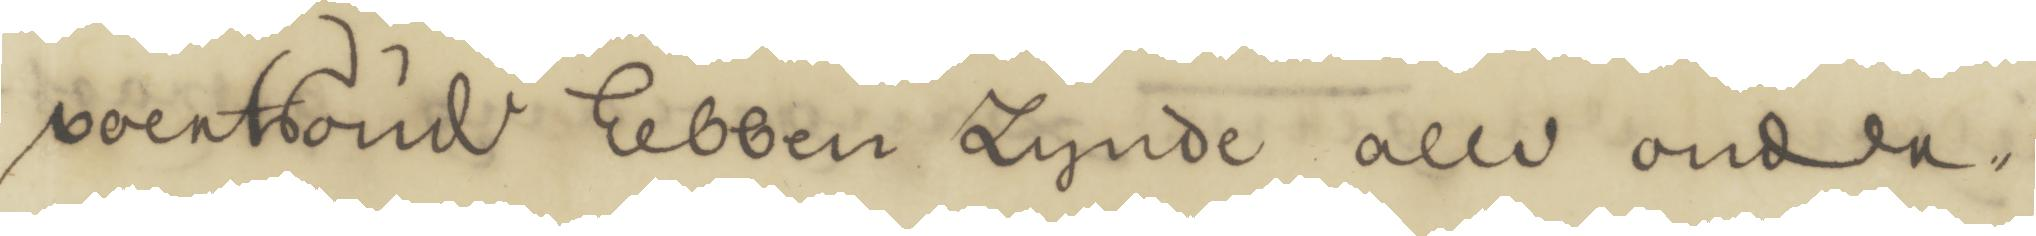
voertsoude hebben zijnde alle onder„
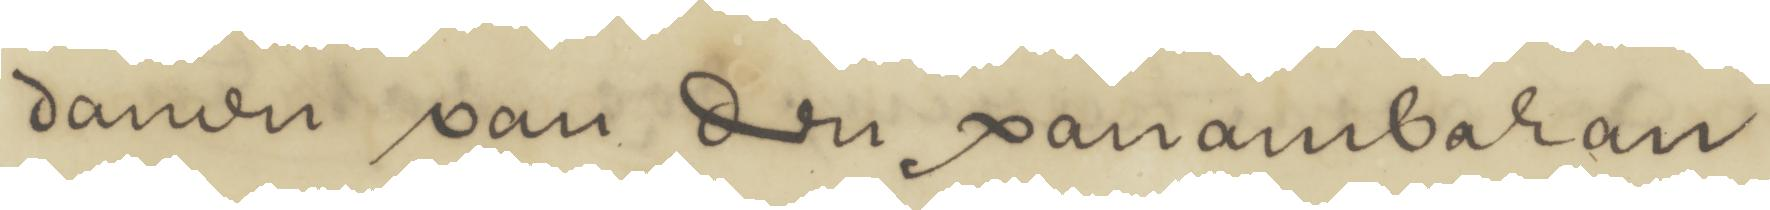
danen van den panambahan
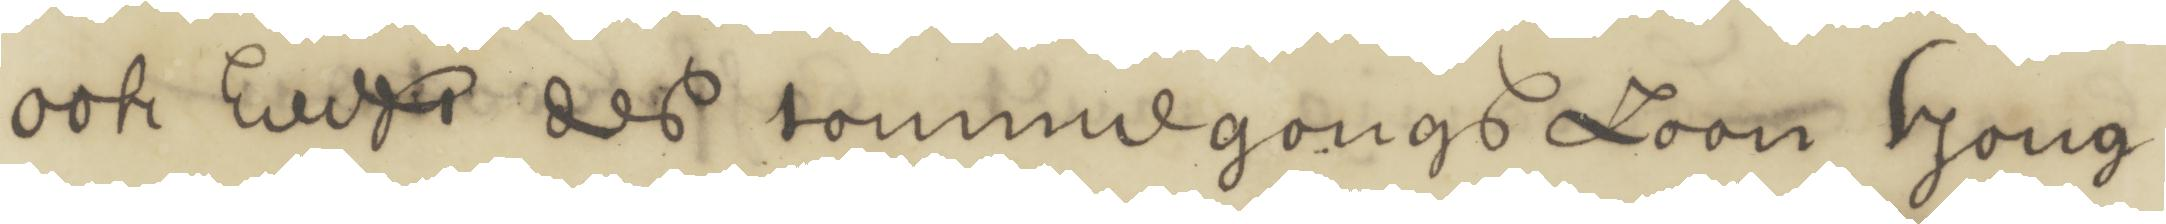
ook heeft des tomme gongs zoon tjong
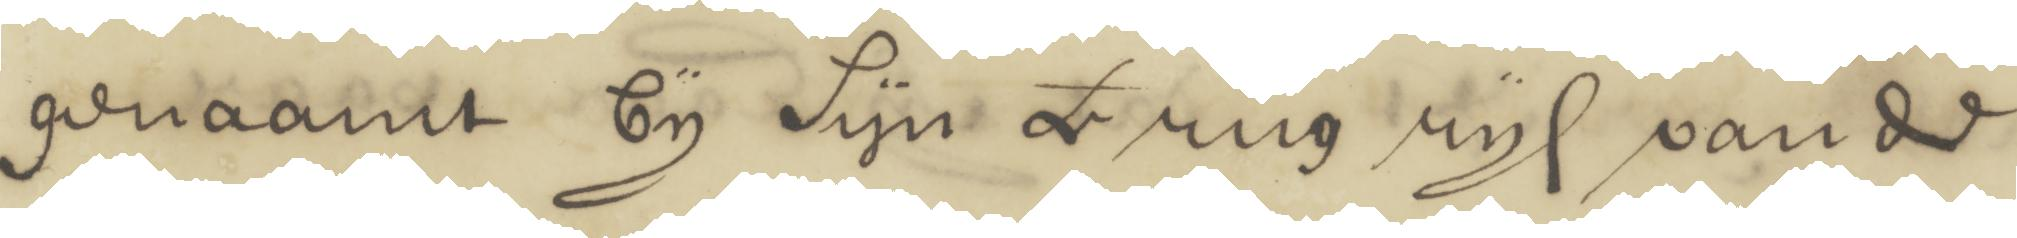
genaamt bij sijn te rug rijs van de
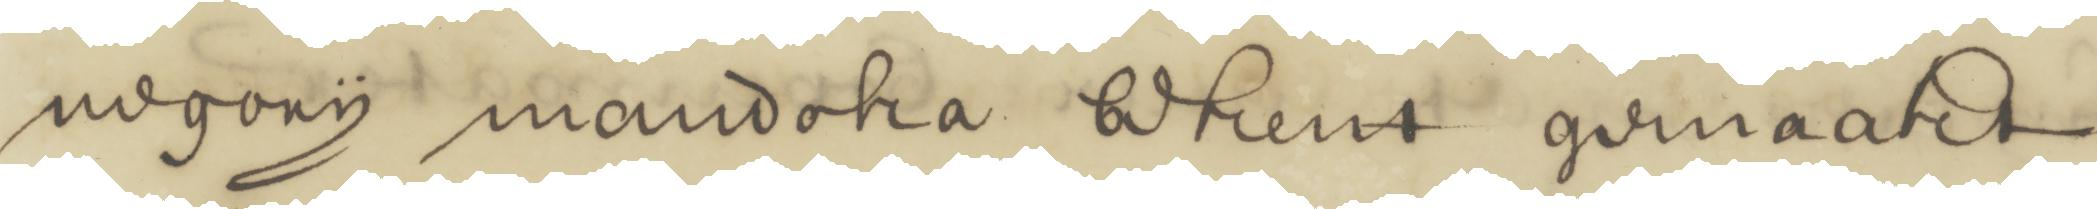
negorij mandoka bekent gemaakt
